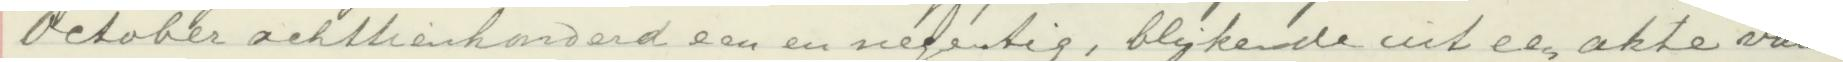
October achttienhonderd een en negentig, blijkende uit een akte van
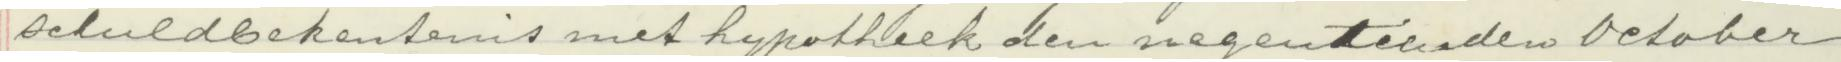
schuldbekentenis met hypotheek den negentienden October
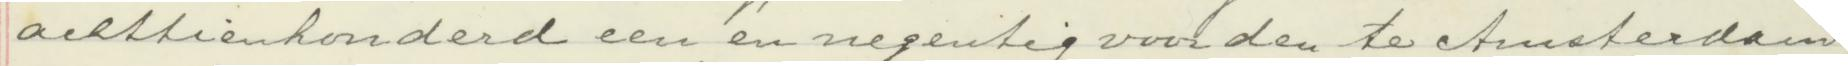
achttienhonderd een en negentig voor den te Amsterdam
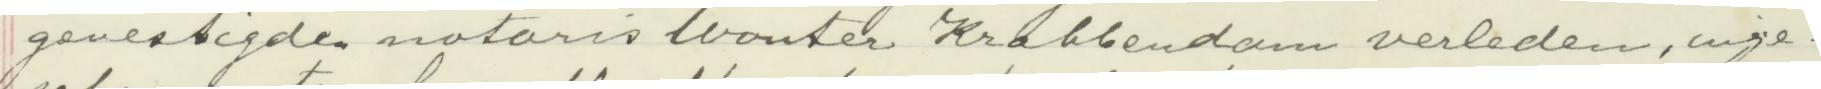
gevestigden notaris Wouter Krabbendam verleden, inge
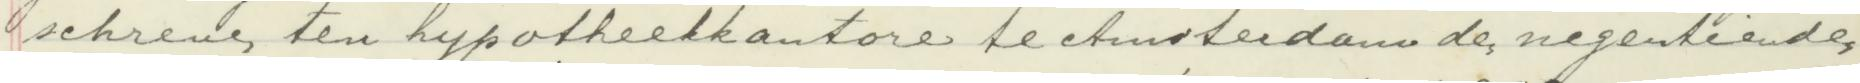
schreven ten hypotheekkantore te Amsterdam den negentienden
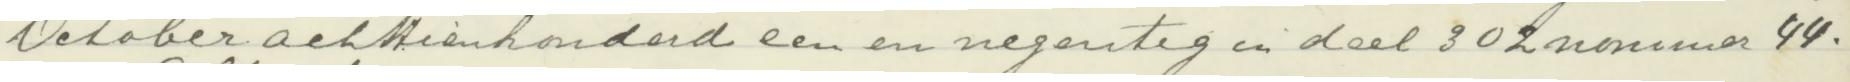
October achttienhonderd een en negentig in deel 302 nommer 44
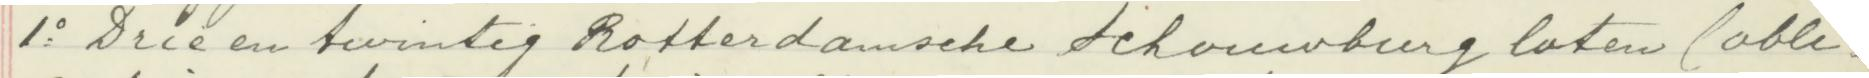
1:o Drie en twintig Rotterdamsche Schouwburg loten (obli-
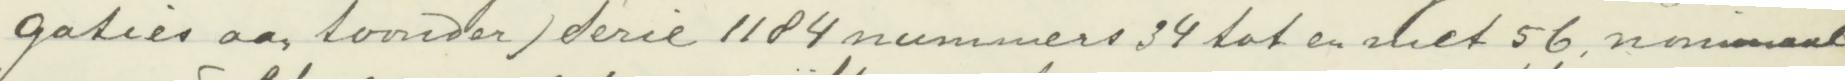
gaties aan toonder) Serie 1187 nummers 34 tot en met 56, nominaa
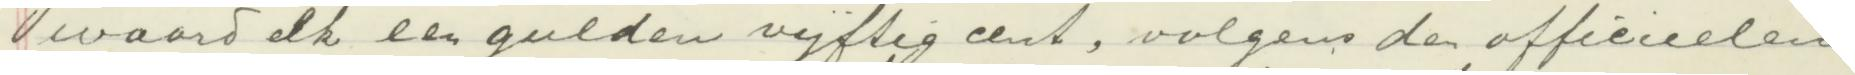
waard elk een gulden vijftig cent, volgens den officieelen
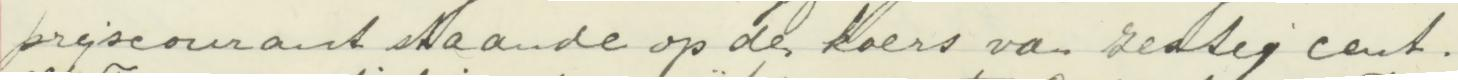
prijscourant staande op de koers van zestig cent
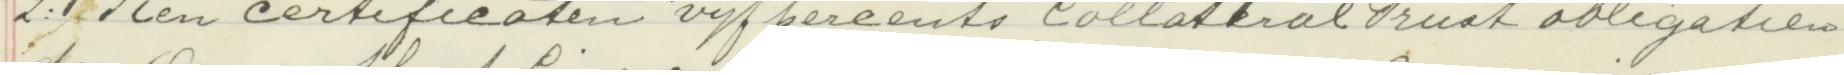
2:o Tien certificaten vijf percents Collateral Trust obligatien
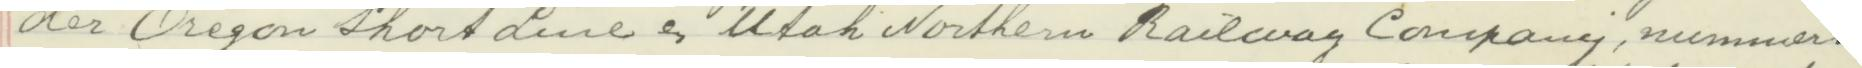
der Oregon Short Line en Utah Northern Railway Company, nummers
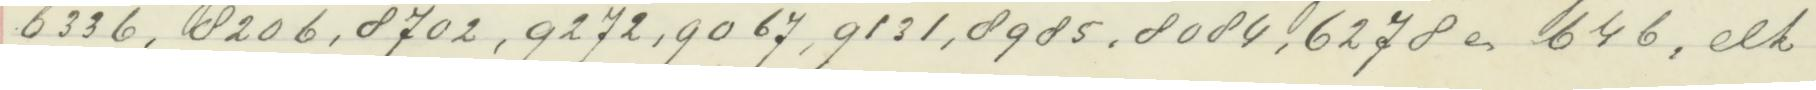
6336, 8206, 8702, 9272, 9067, 9131, 8985, 8084, 6278 en 646, elk
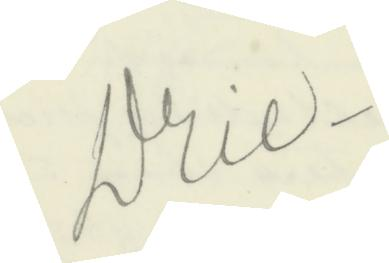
Drie-
